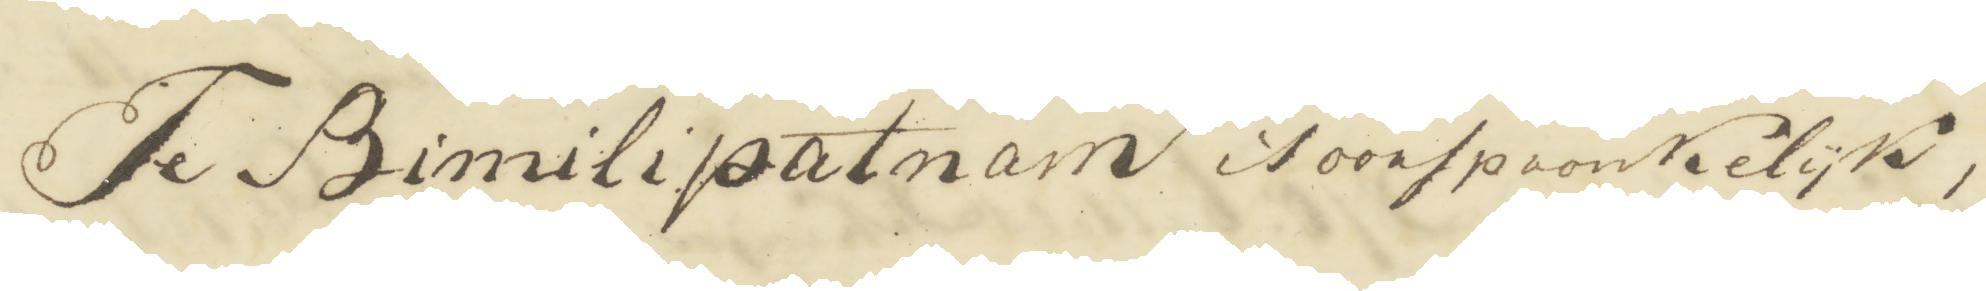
Te Bimilipatnam is oorspronkelijk,
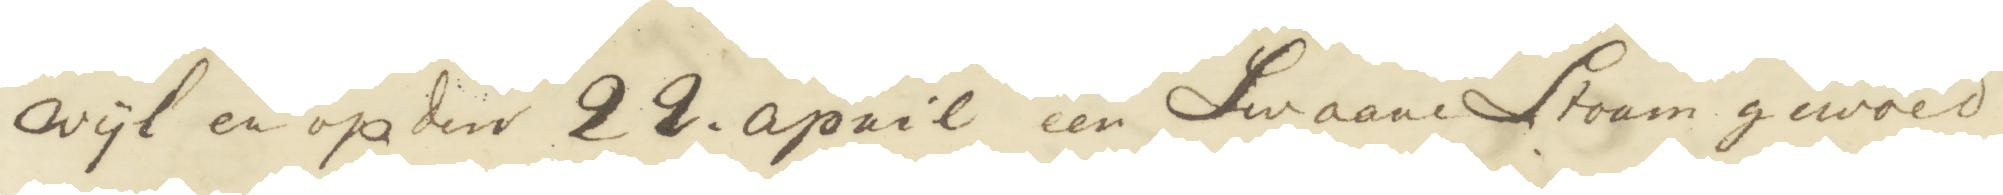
wijl er op den 22. april een swaare storm gewoed
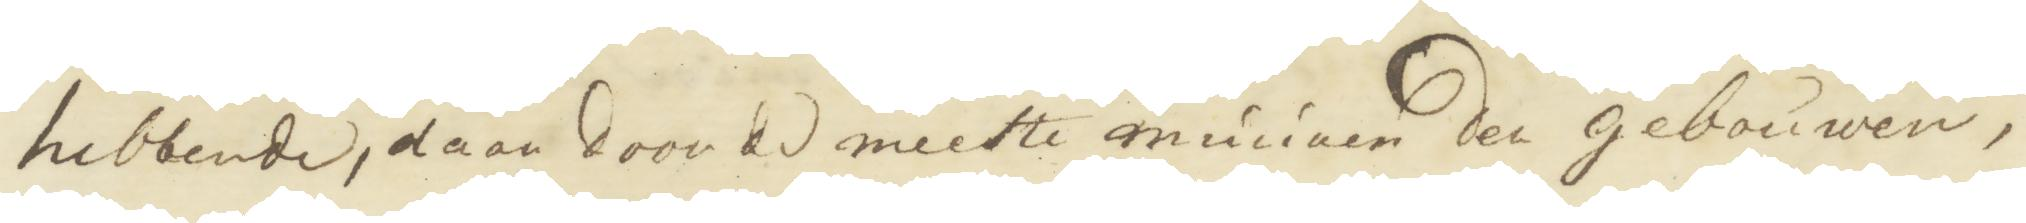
hebbende, daar door de meeste muuren der gebouwen,
